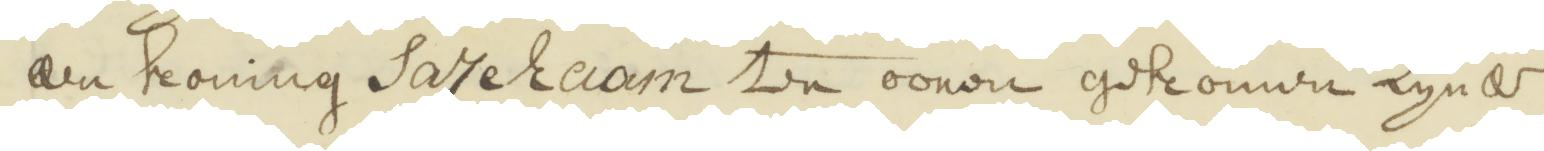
den koning Sajehaam ter ooren gekomen zijn de
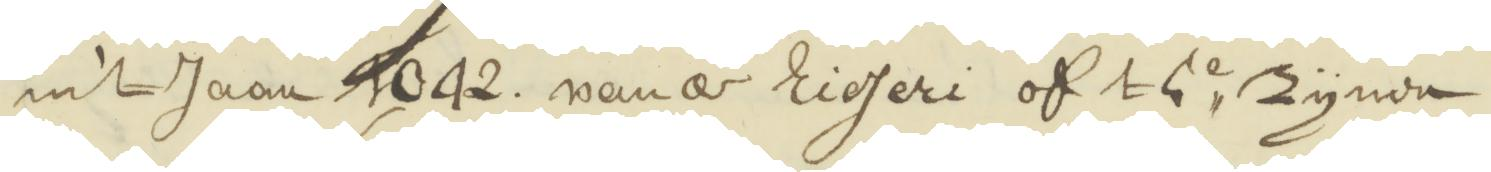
in’t Jaar 1042. van de hiejeri of t 5„e zijner
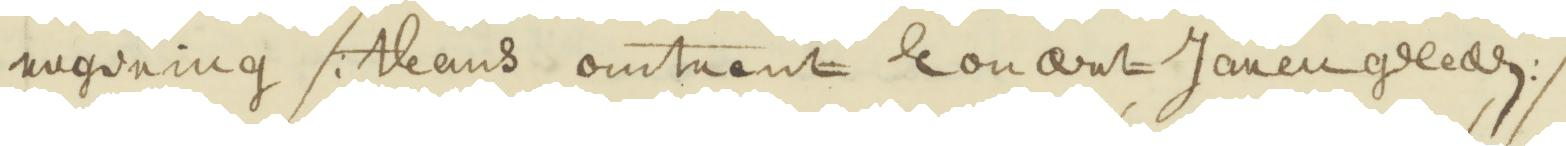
regering /:thans omtrent hondert Jaren geleden:
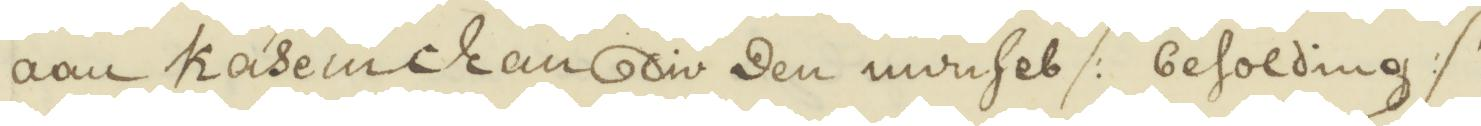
aan Kasemchan die Een menseb /: besolding :/
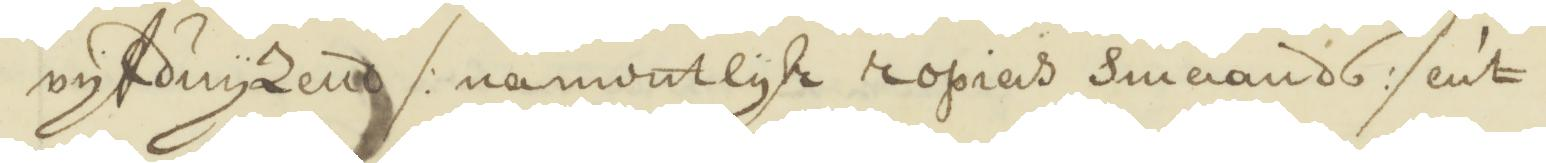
vijfduijzend /: namentlijk ropias smaands :/ en’t
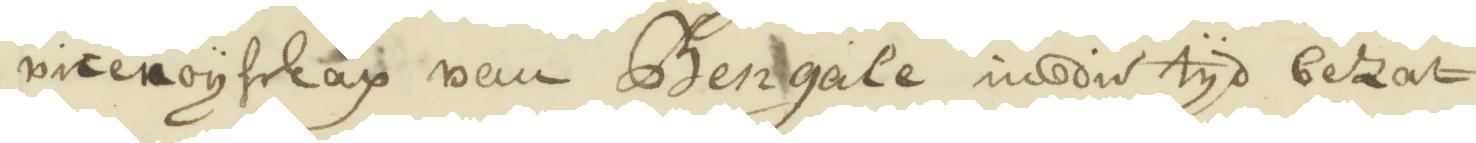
viceroijschap van Bengale in die tijd bezat
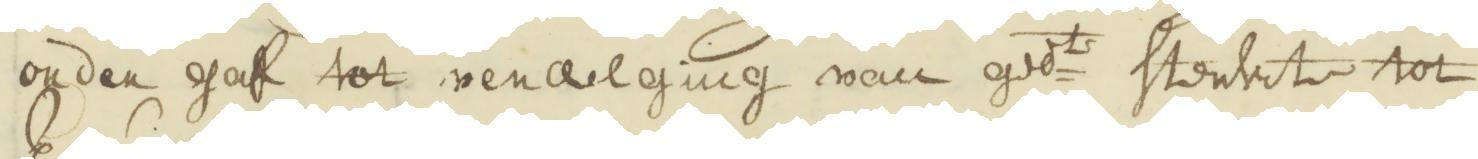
order gaf tot verdelging van ged=te sterkte tot
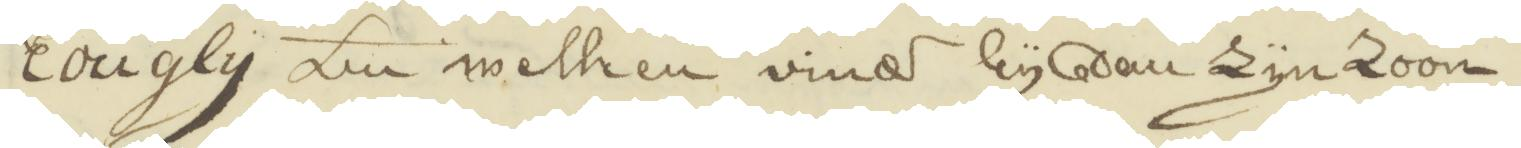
houglij ten welken einde hij dan zijn zoon
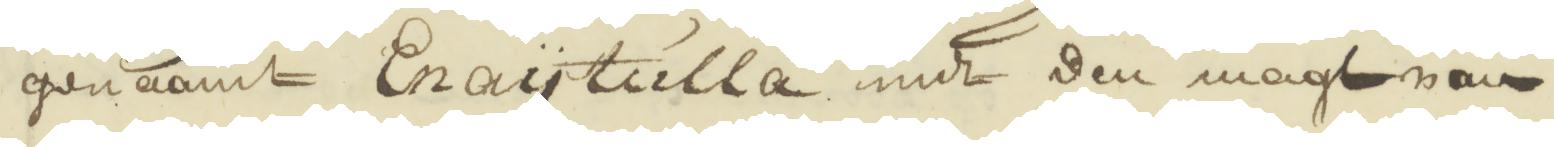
genaamt Enaijtulla met een magt van
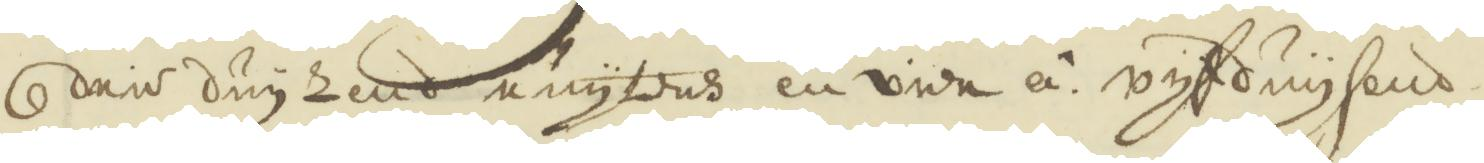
drie duijzend ruijtens en vier â. vijfduijsend
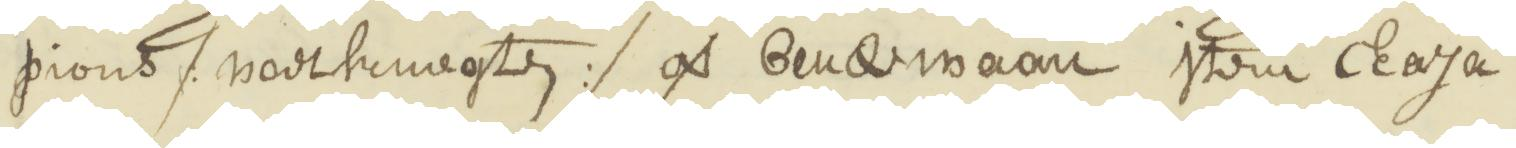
pions /: voetknegten :/ over bendewaan jtem chaja
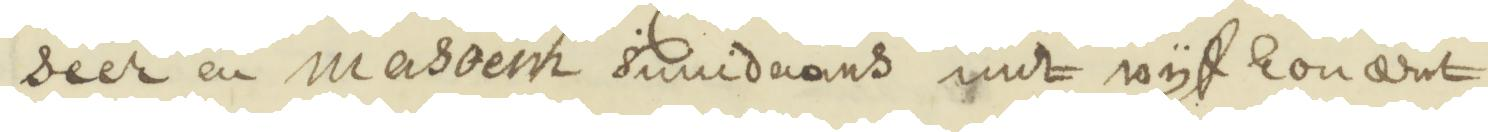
seer en masoem simidaars met vijf hondert
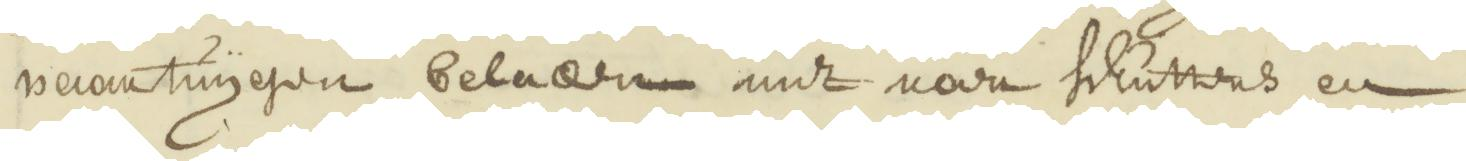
vaartuijgen beladen met roer schutters en
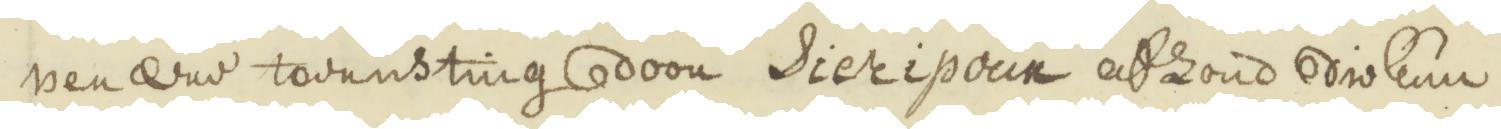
verdere toerusting door Sieripour afzond die hun
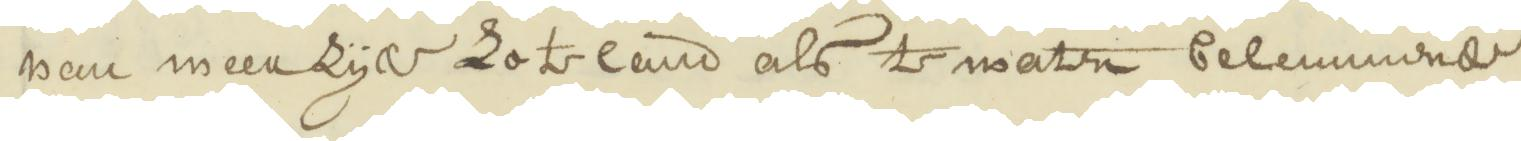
van meer zijde zo te land als te water belemmerde
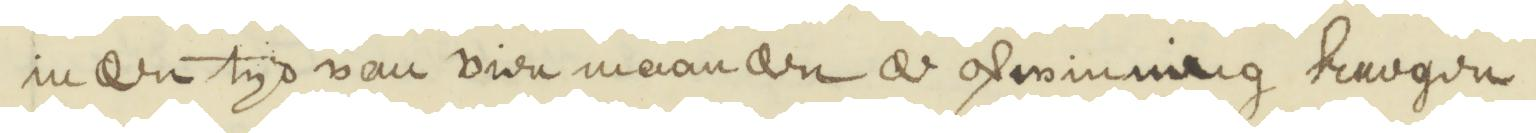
in den tijd van vier maanden de overwinning kregen
